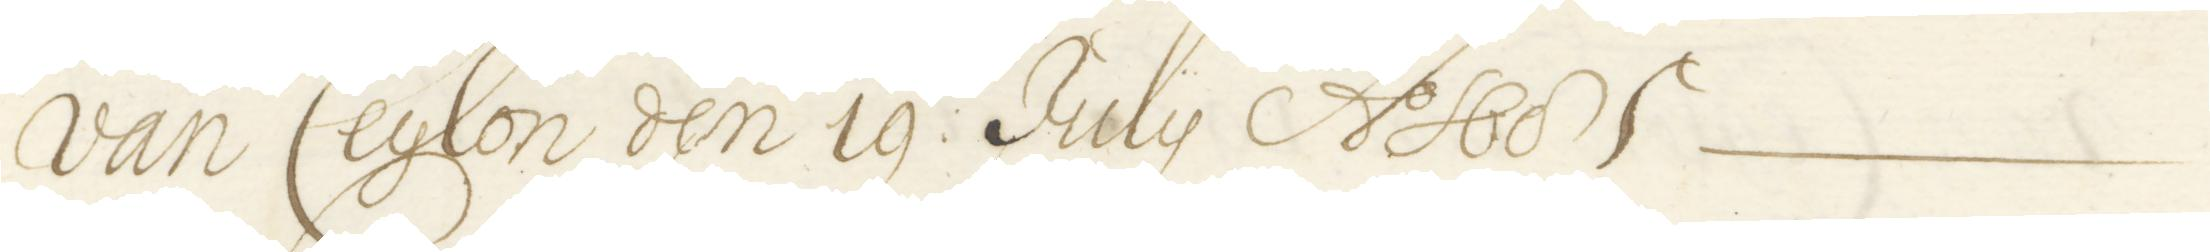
van Ceijlon den 19:' Julij Ao 1685 —
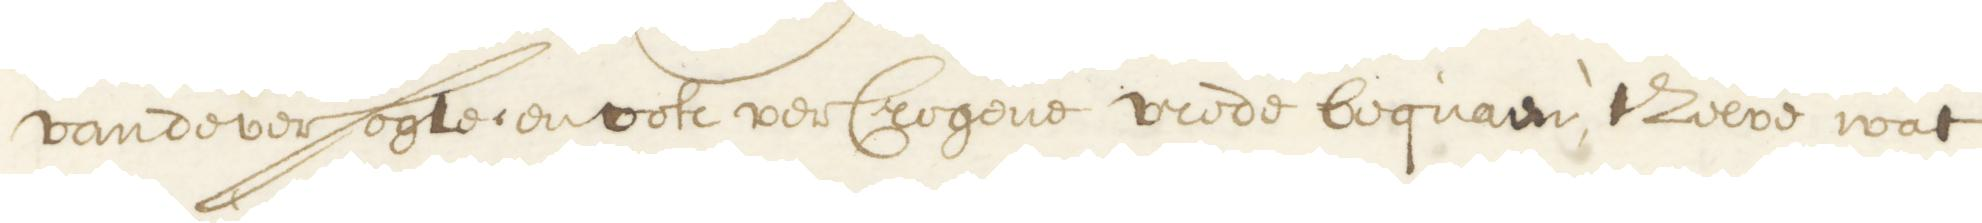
van de versogte en ook vercregene vrede bequaen, 'tzelve wat
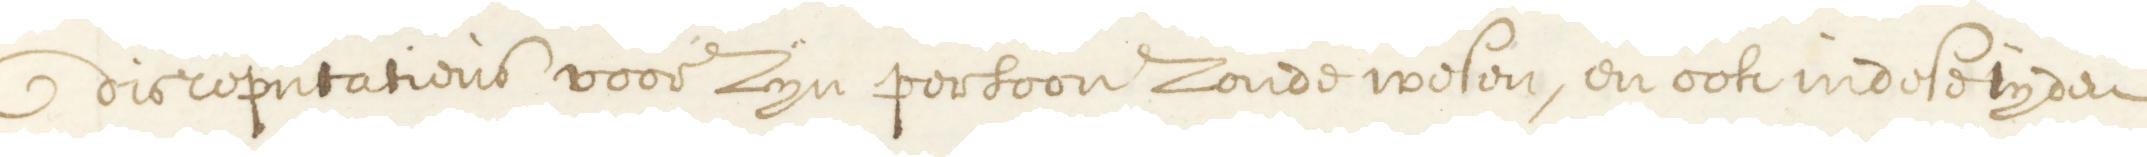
disreputatieus voor zijn persoon zoude wesen, en ook in dese tijden
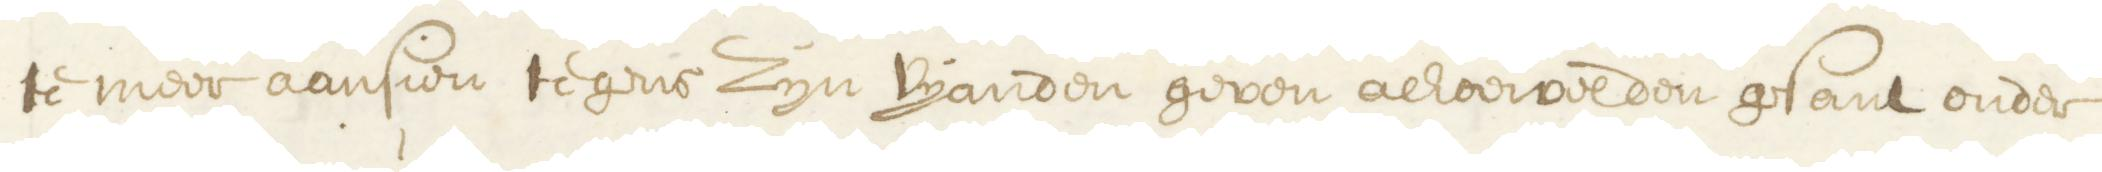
te meer aansien tegens zijn vijanden geven alhoewelden gesant onder
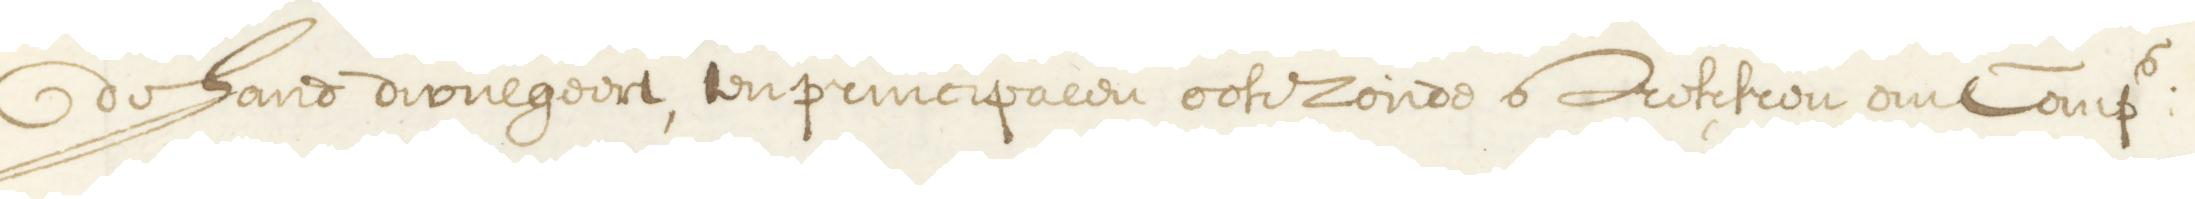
dehand divulgeert, ten principalen ook zoude strekken om Comp:s
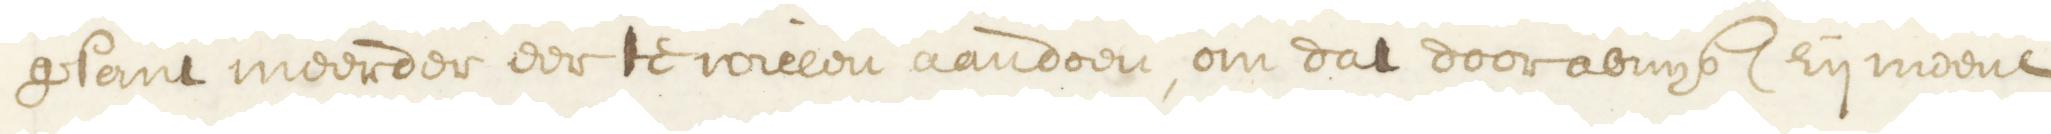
gesant meerder eer te willen aandoen, om dat doorabuijs (hij meene
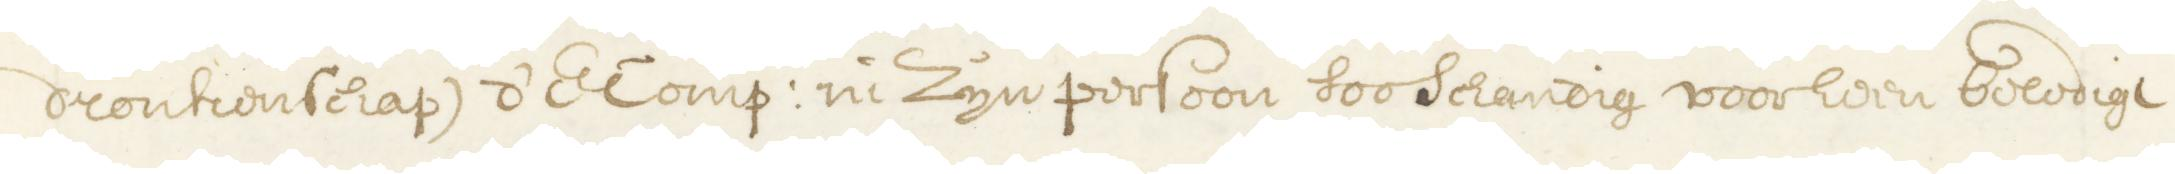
dronkenschap) d’ EComp:e in zijn persoon soo schandig voorheen beledigt
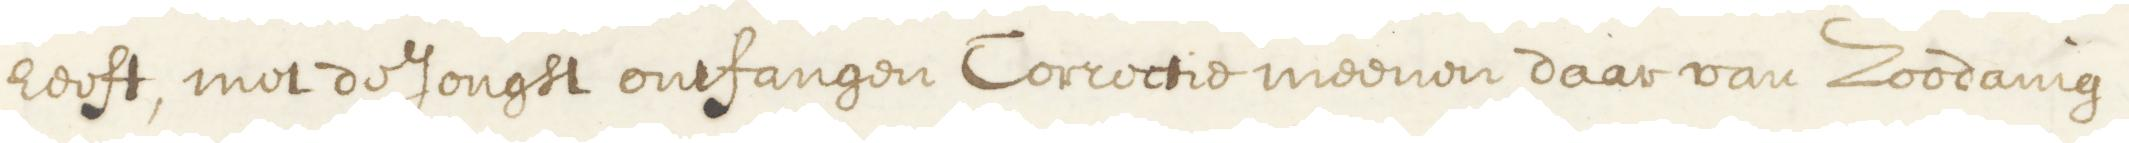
heeft, met de Jongst ontfangen Correctie meenen daar van zoodanig
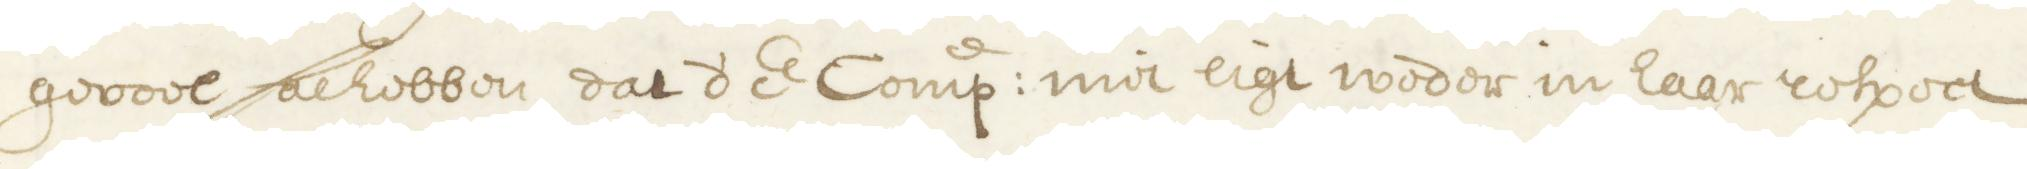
gevoel salhebben, dat d' E Comp:e niet ligt weder in haar respect
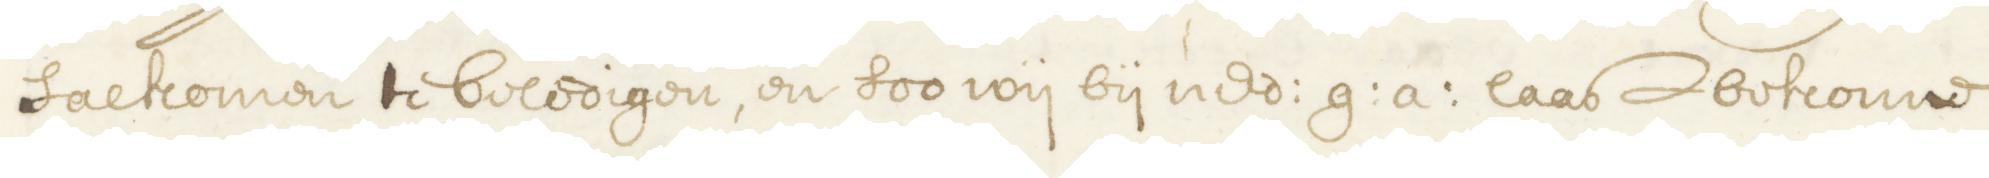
salkomen te beledigen, en soo wij bij uEd: g: a: laast bekome
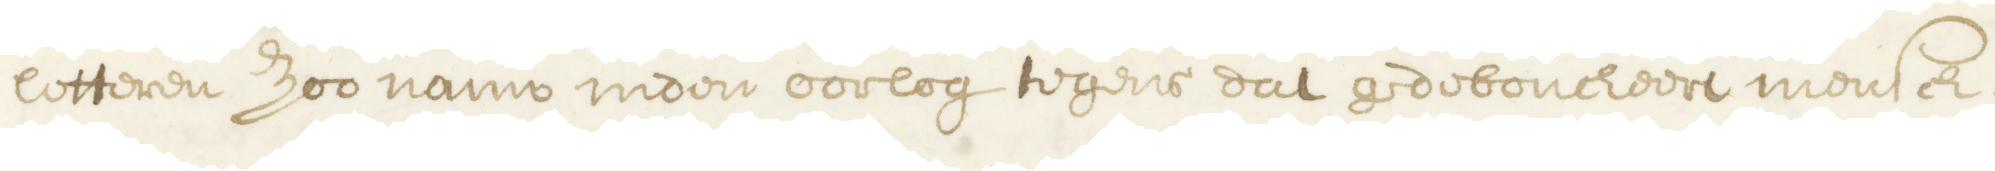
letteren zoo nauw inden oorlog tegens dat gedeboucheert mensch
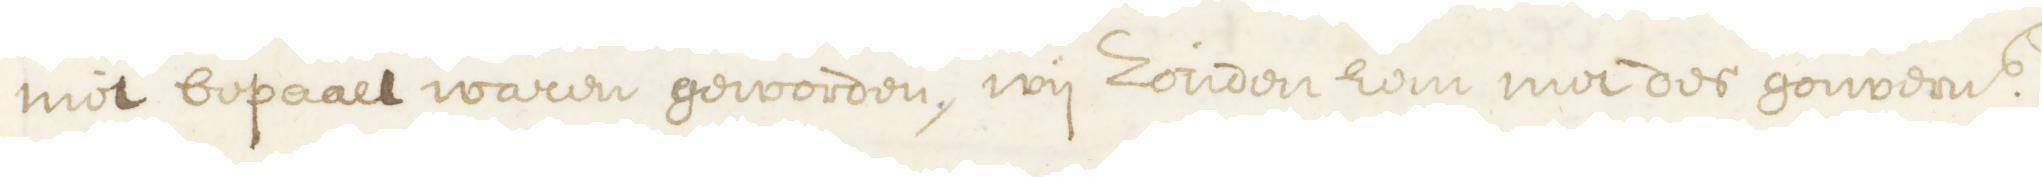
niet bepaalt waren geworden, wij zouden hem met des gouvern.s
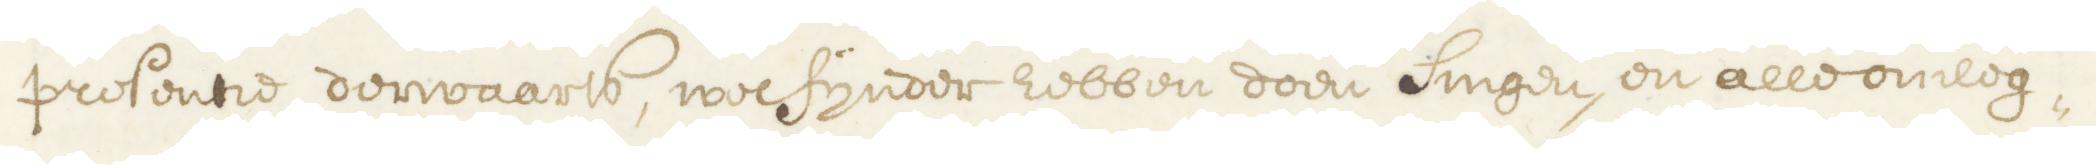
presentie derwaarts, welsijnder hebben doen singen, en alleomleg„
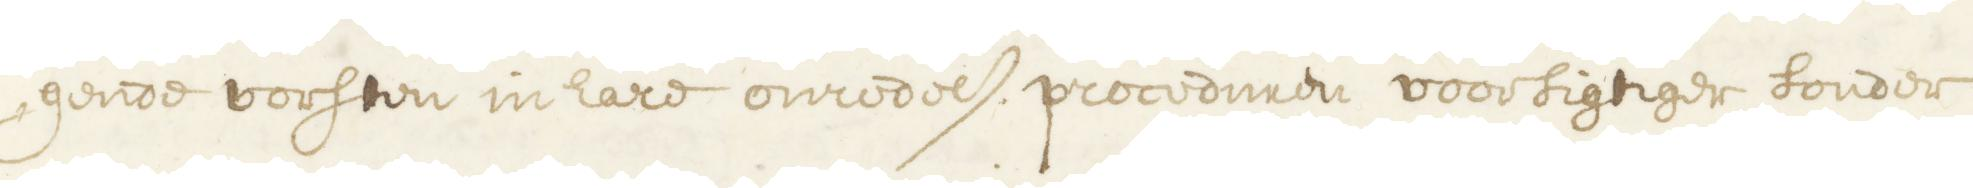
gende vorsten in hare onredelijk proceduren voorsigtiger sonder
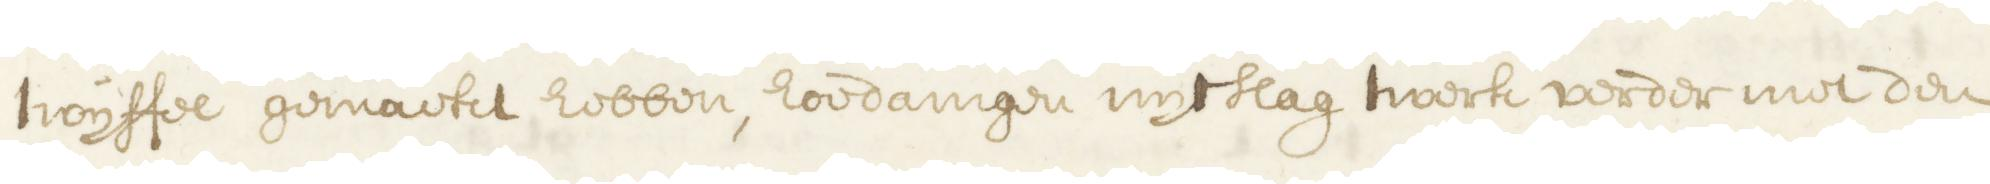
twijffel gemaekt hebben, hoedanigen uijtslag 'twerk verder met den
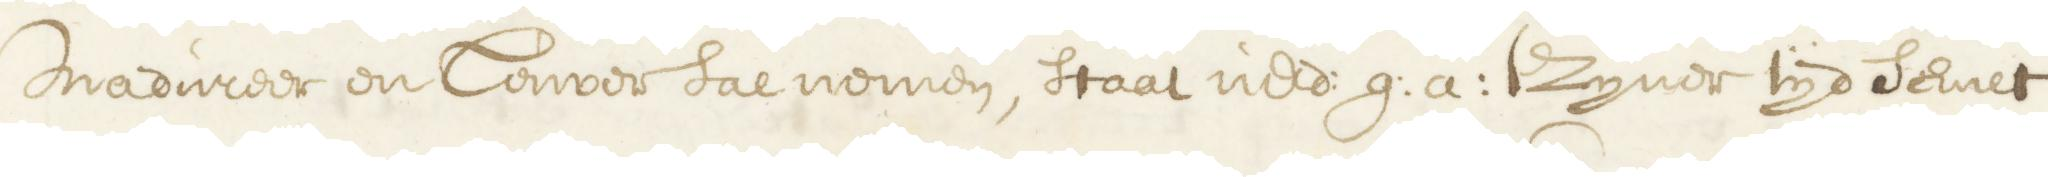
Madureer en Tonver sal nemen, staat uEd: g: a: 'tzijner tijd schult
